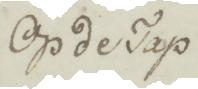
Op de Tap
